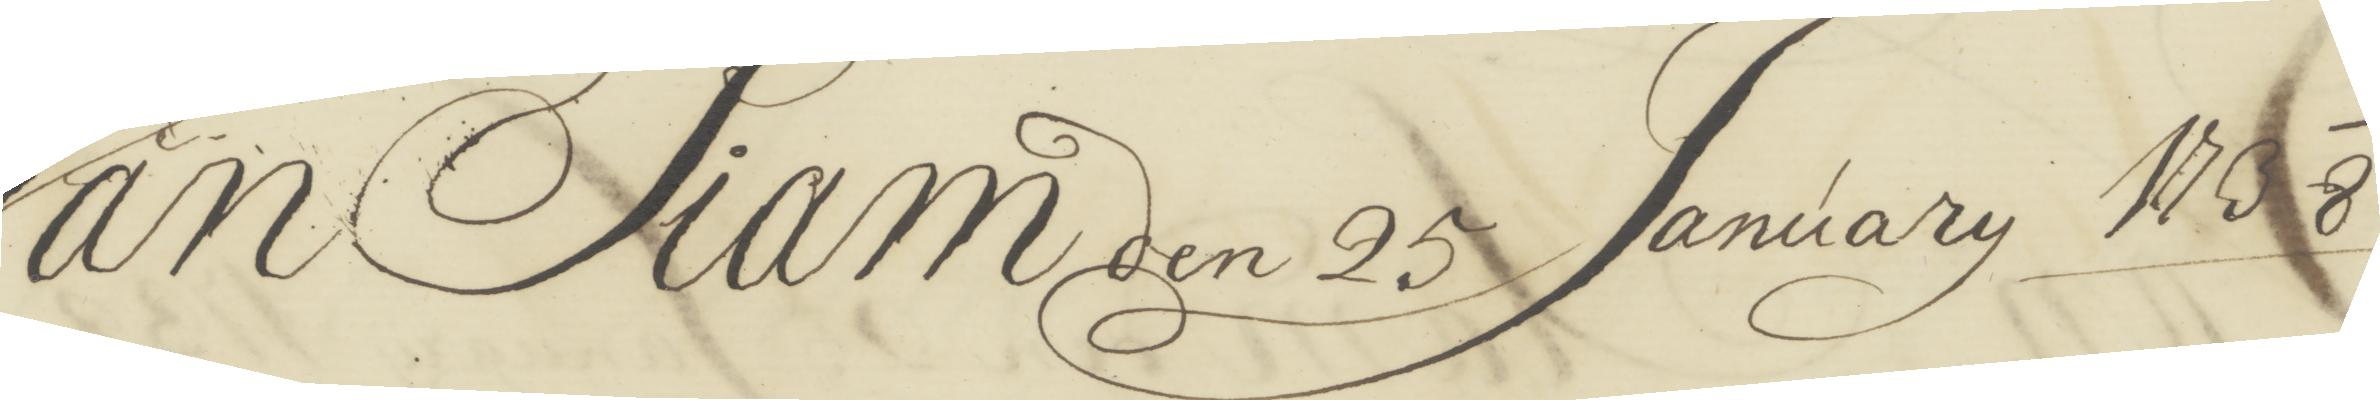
Van Siam den 25 January 1738
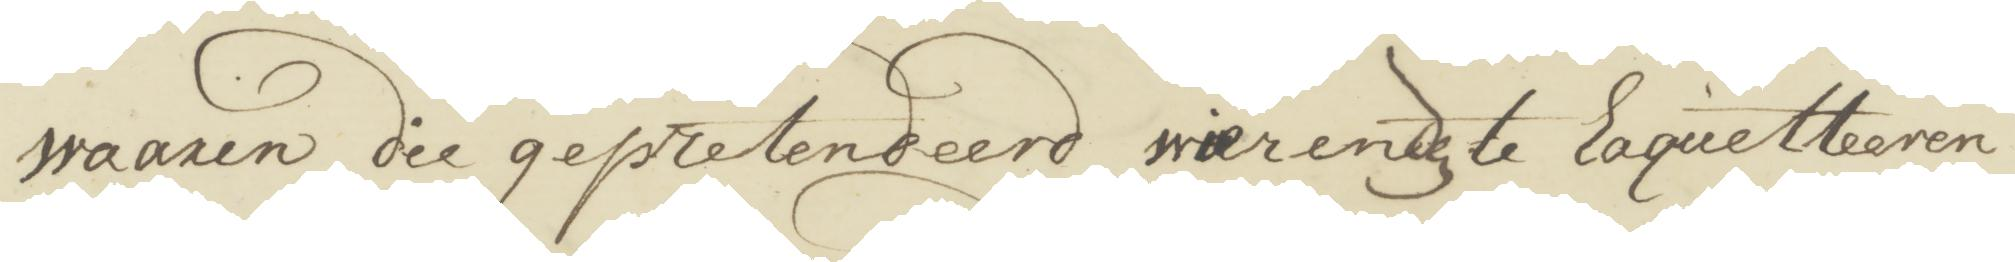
waaren die gepretendeerd wierenden te haquetteeren
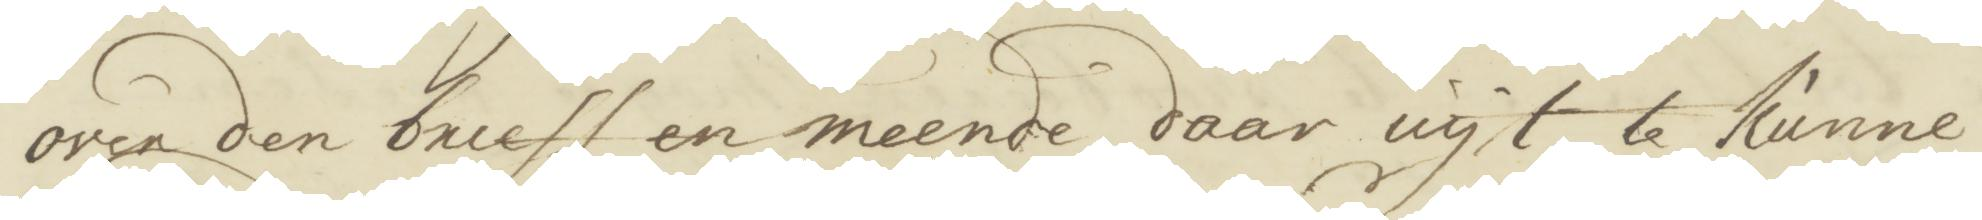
over den brieff en meende daar uijt te kunne
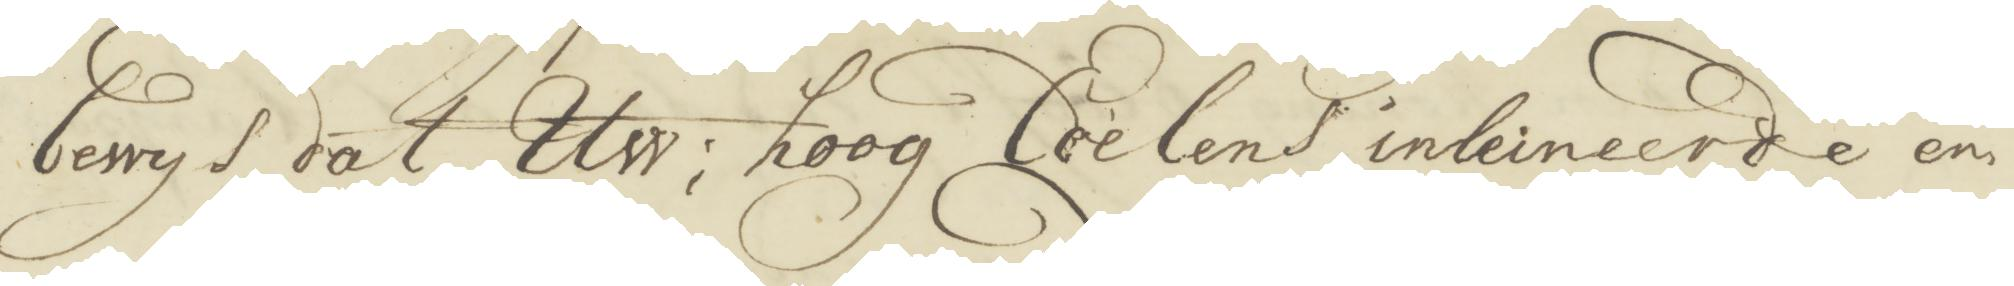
bewys dat Uw; hoog Edelens inleineerde en
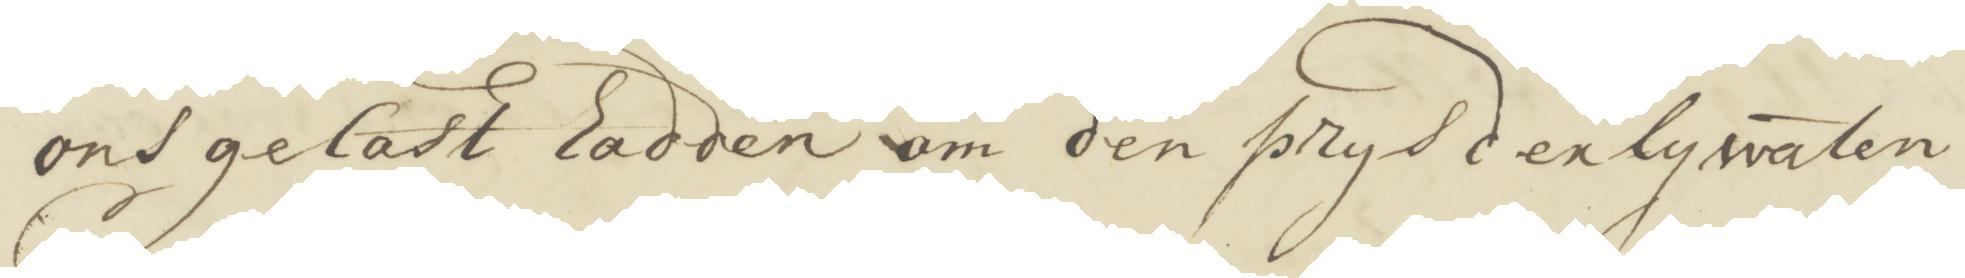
ons gelast hadden om den prys der lywaten
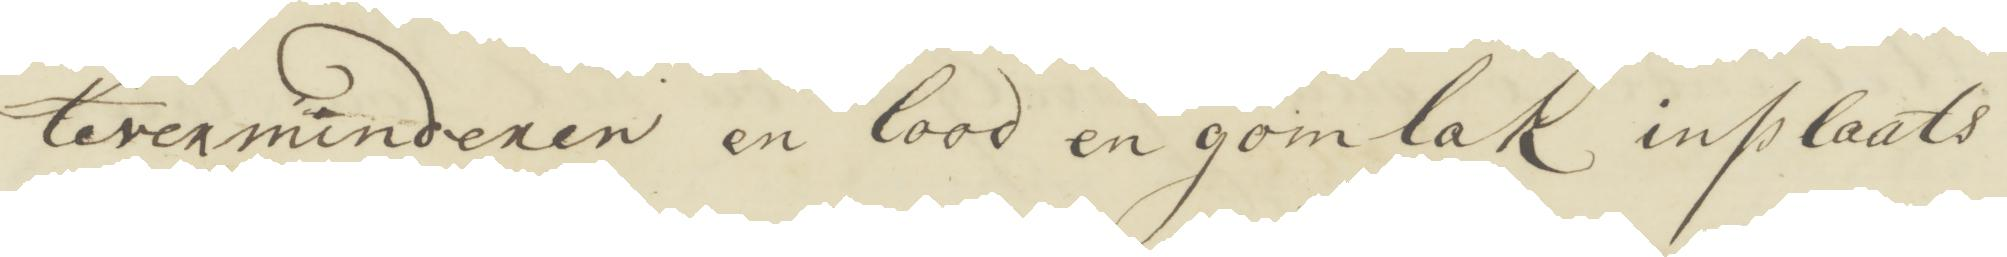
teverminderen en lood en gomlak in plaats
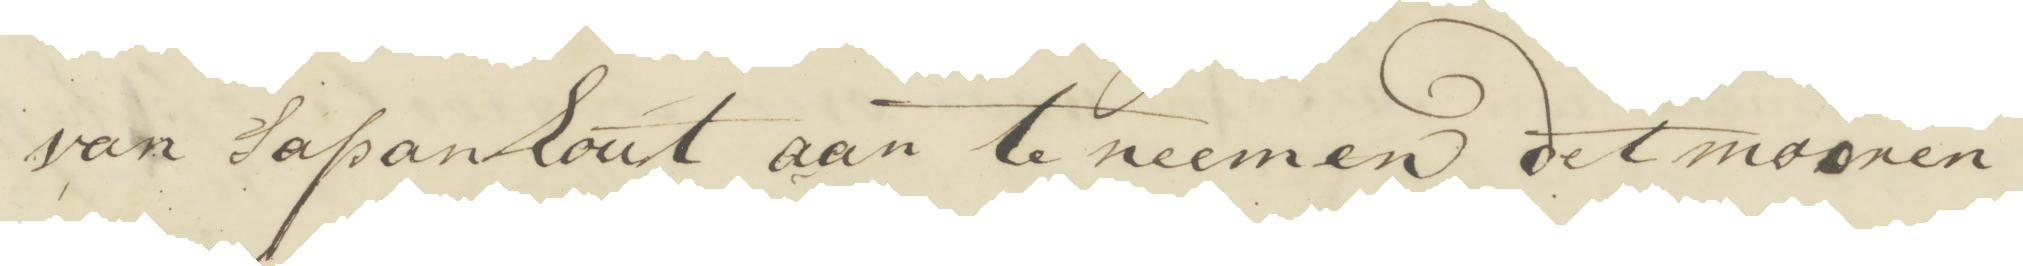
van sapan-hout aan te neemen det mooren
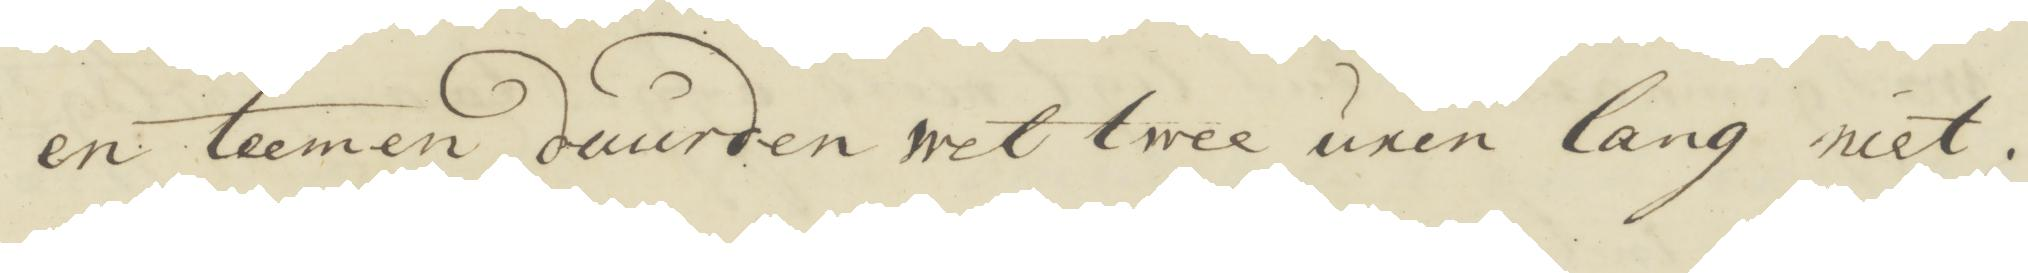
en teemen duurden wel twee uren lang niet.
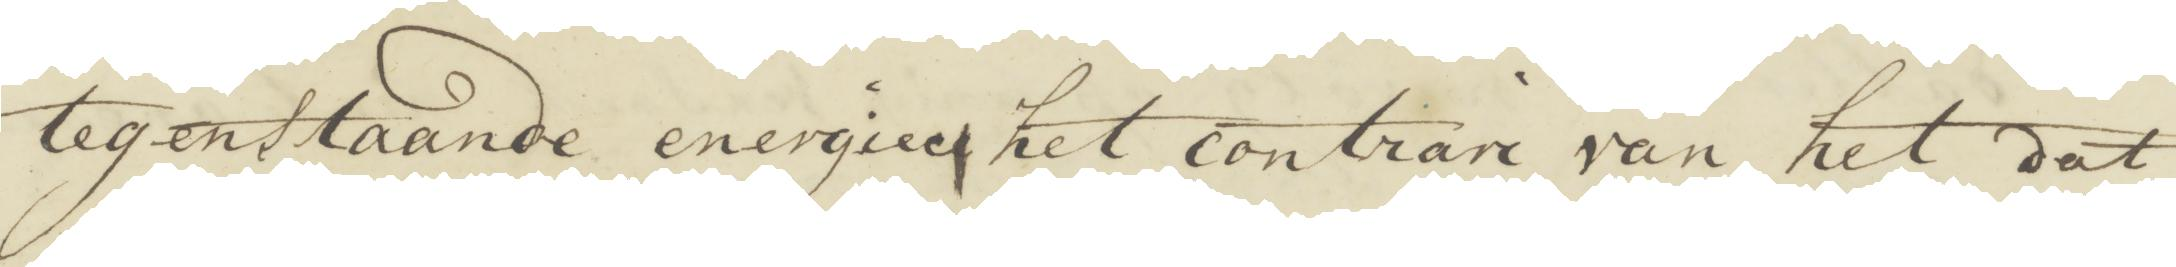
tegenstaande energiece het contrari van het dat
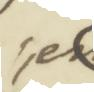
en
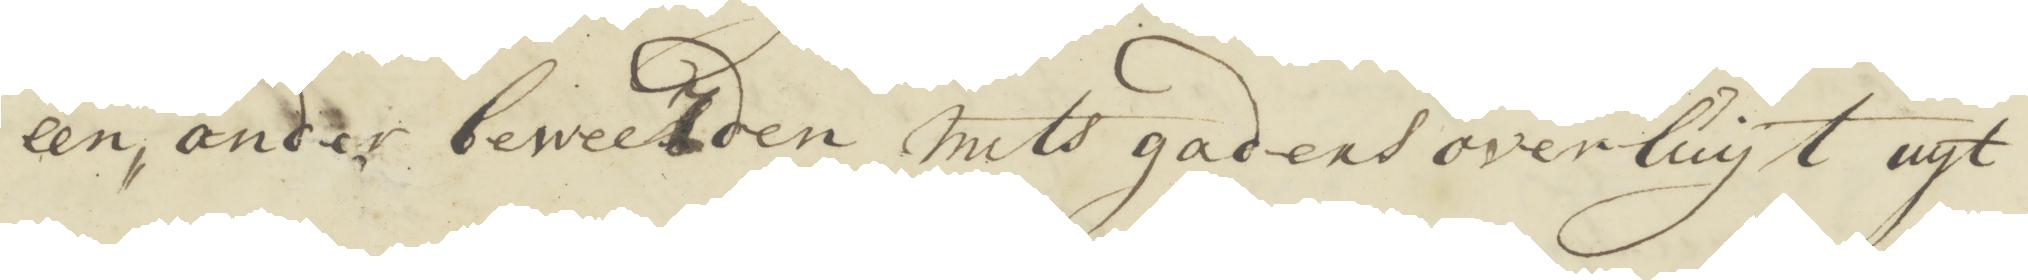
een„ onder beweerden mitsgaders overluijt uyt
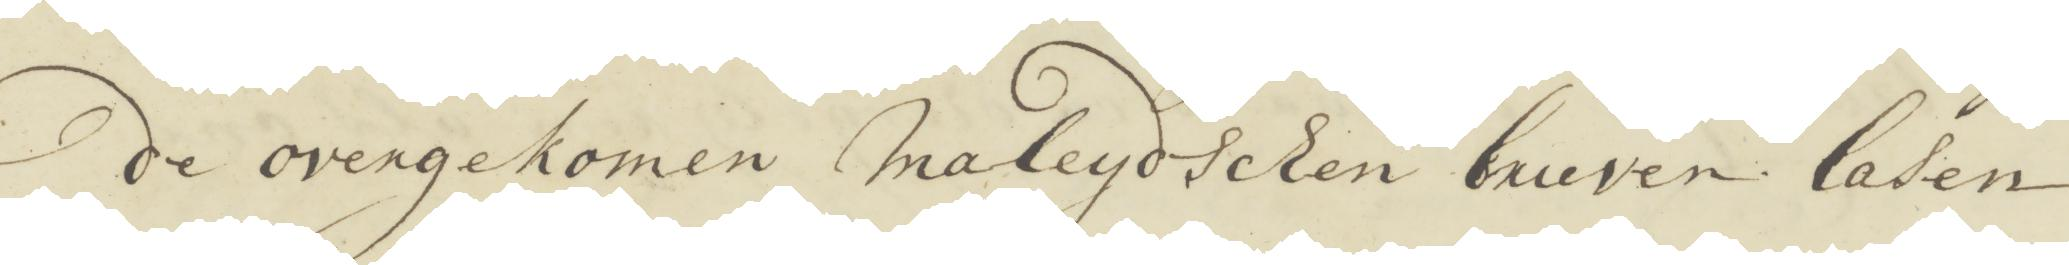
de overgekomen maleydschen brieven lasen
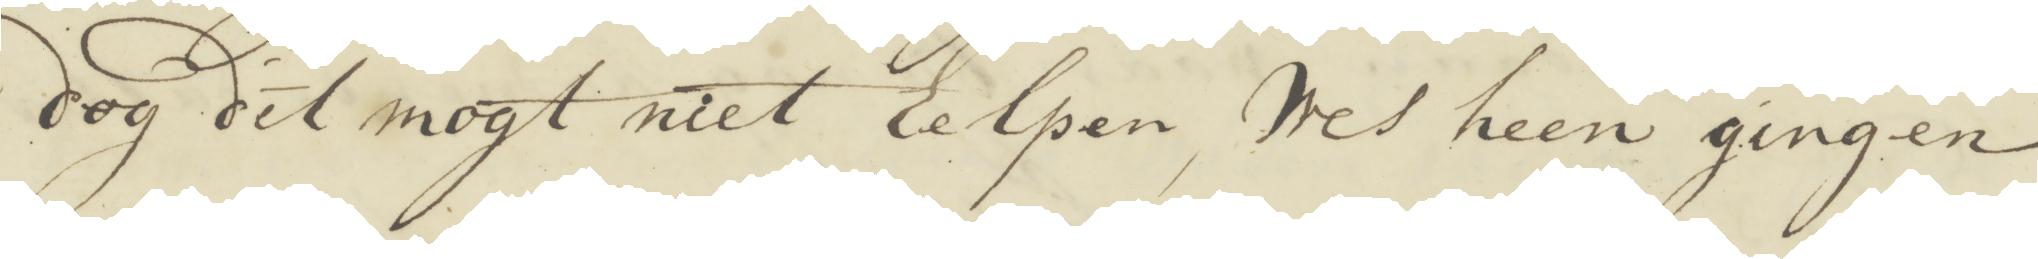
dog dit mogt niet helpen, wes heen gingen
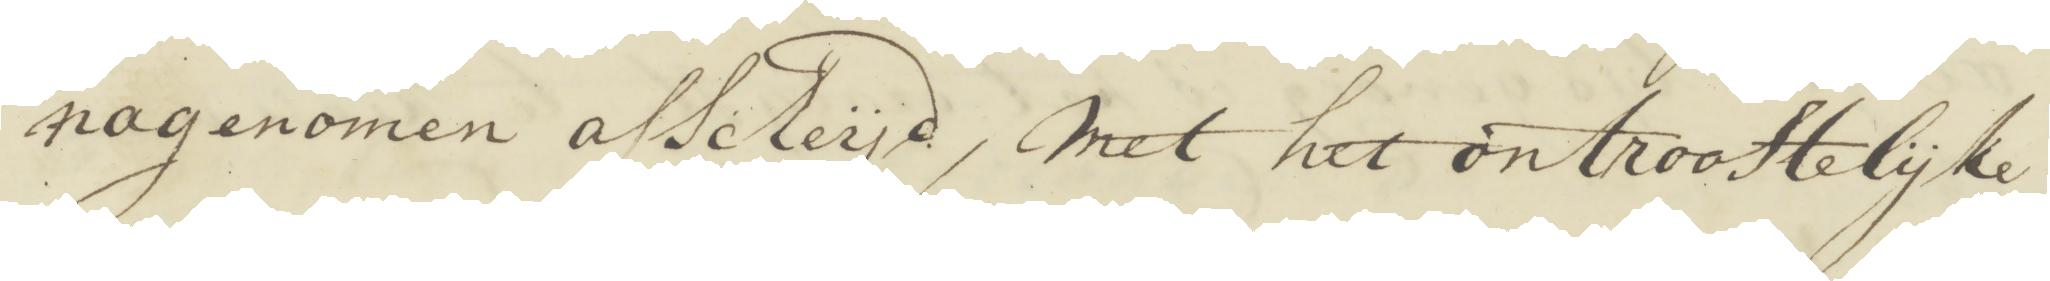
nagenomen afscheijd, met het ontroostelijke
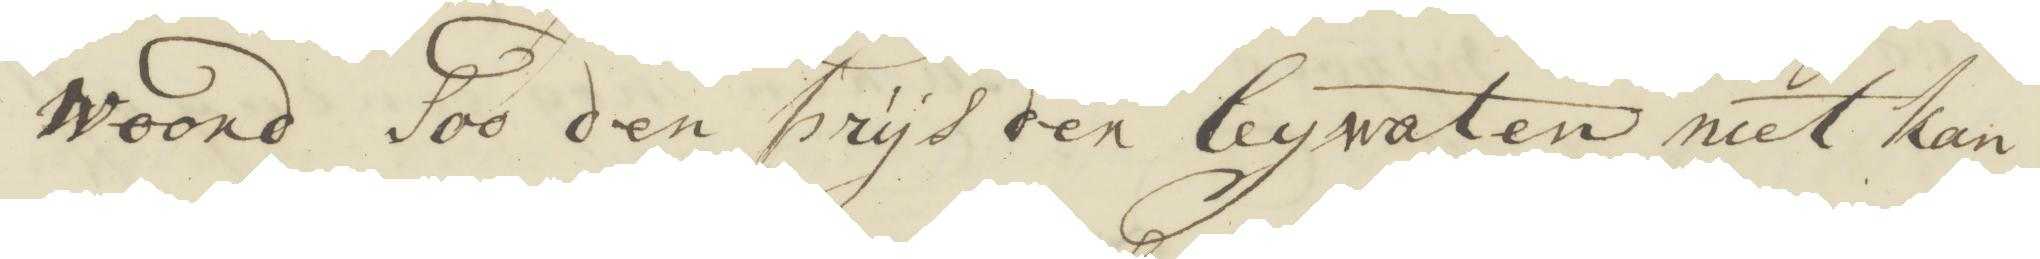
woord soo den prijs der leywaten niet kan
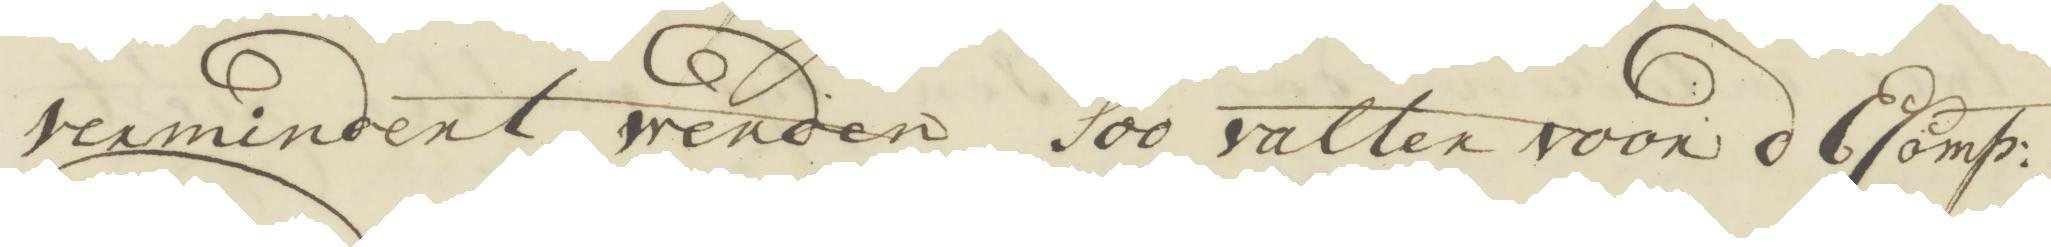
vermindert werden soo valter voor d E Comp:
